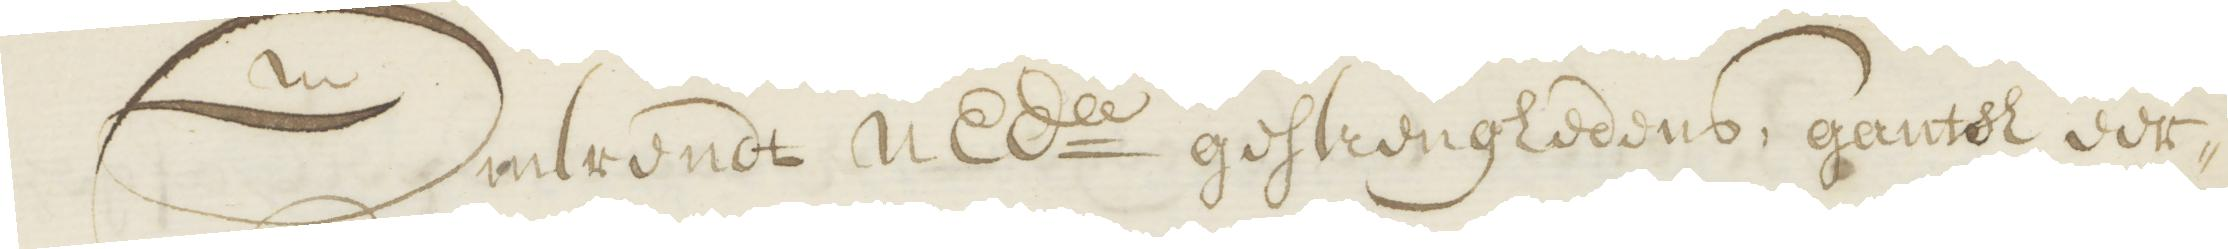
Omtrendt uEd=le gestrenghedens, gantsh eer„
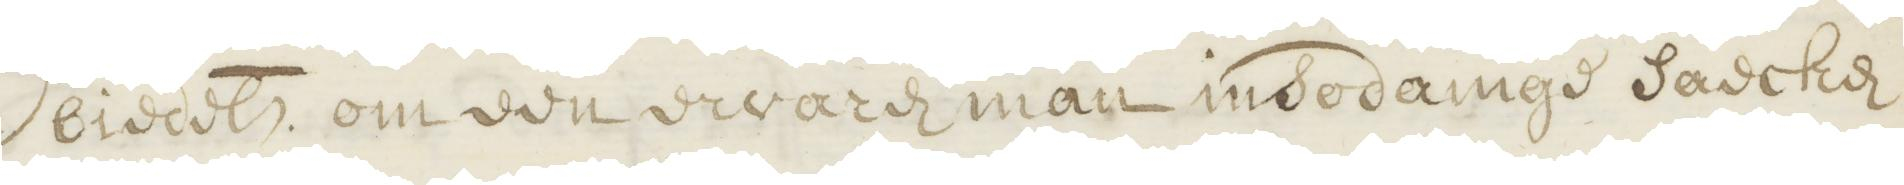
biedelijk om een ervaren man insodanige saecken
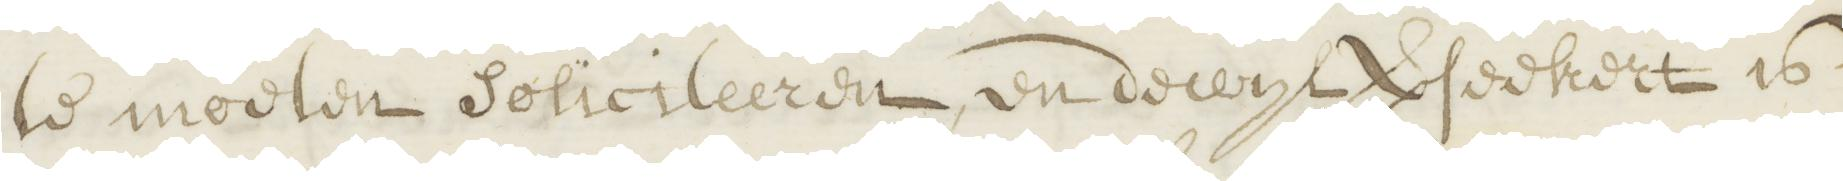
te moeten soliciteeren, en dewijl verseekert is
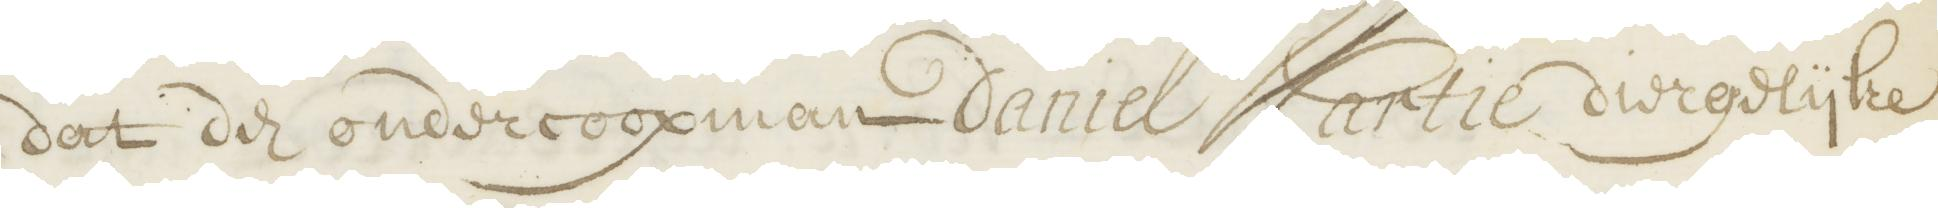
dat den ondercoopman daniel Cartie diergelijke
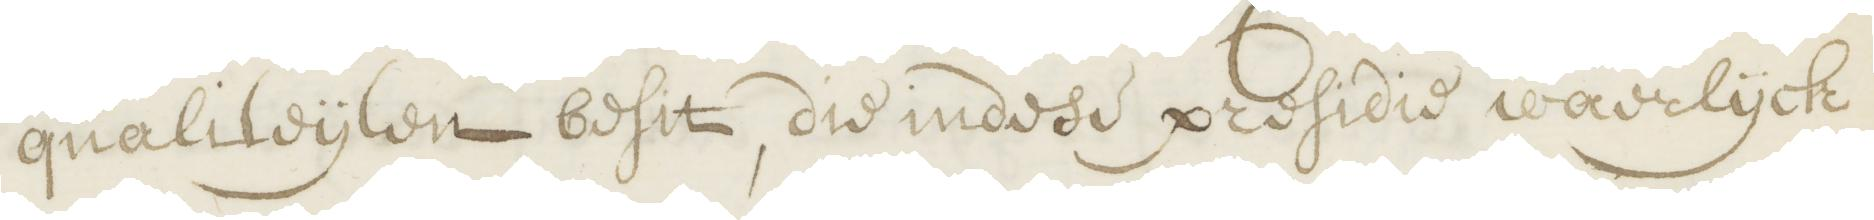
qualiteijten besit, die indese presidie waerlijck
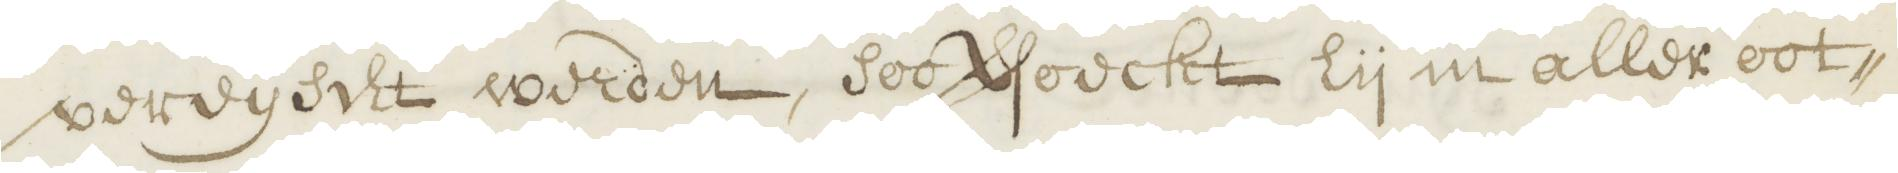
vereijscht werden, soo versoeckt hij in aller oot„
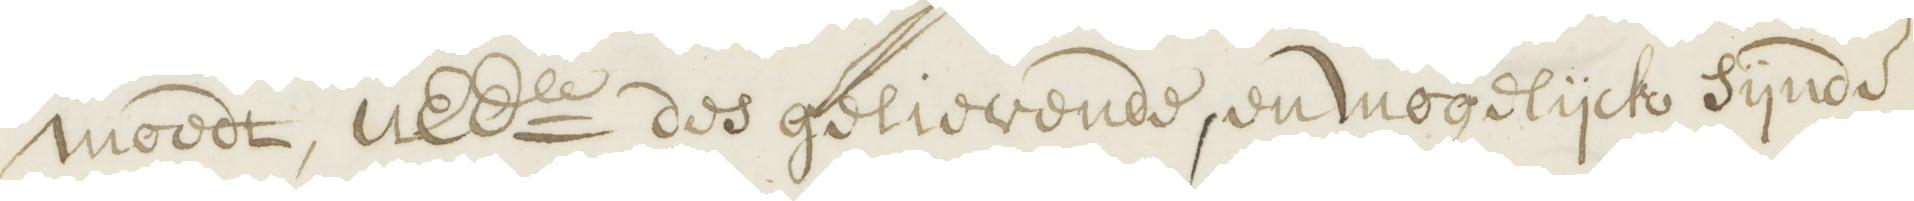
moedt, uEd=le des gelievende, en mogelijck sijnde
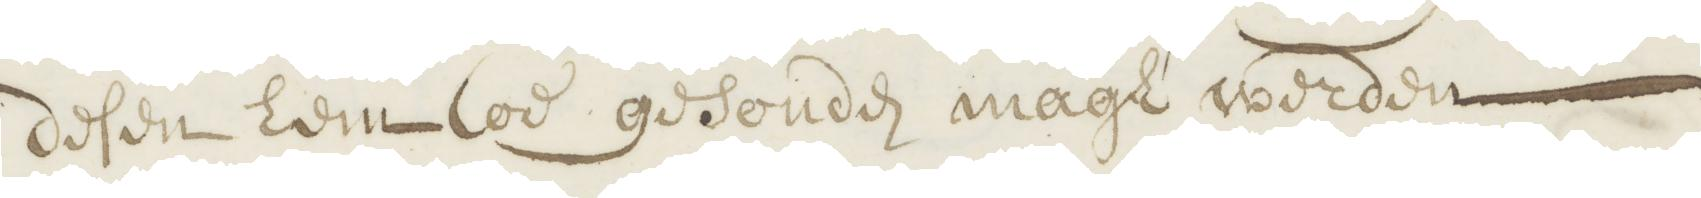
desen hem toe gesonden magh werden
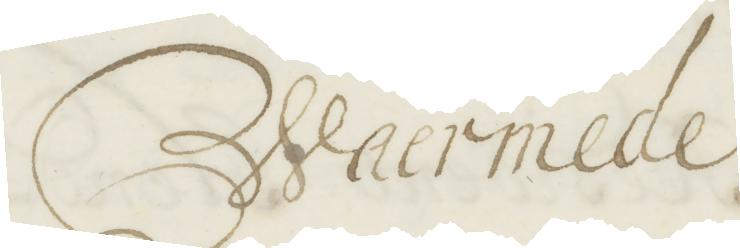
Waermede
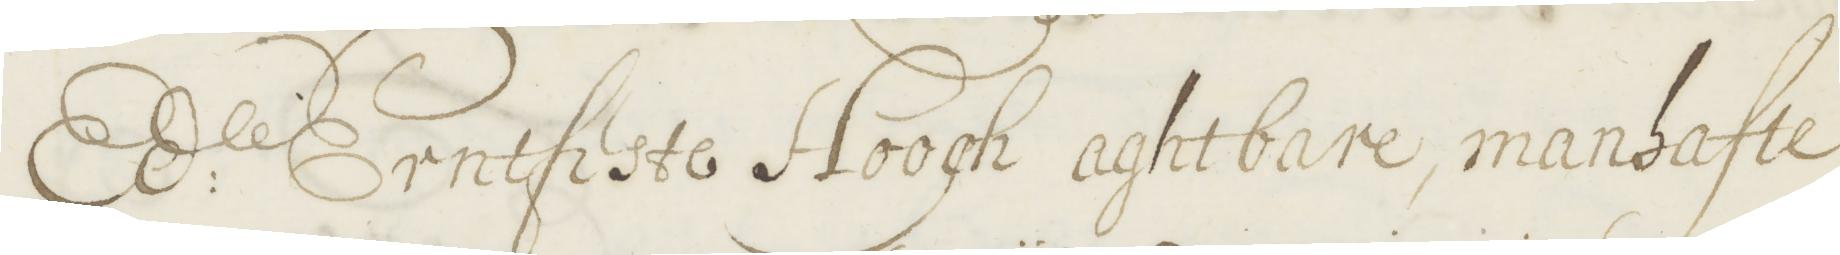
Ed:le Erntfeste Hoogh aghtbare, manhafte
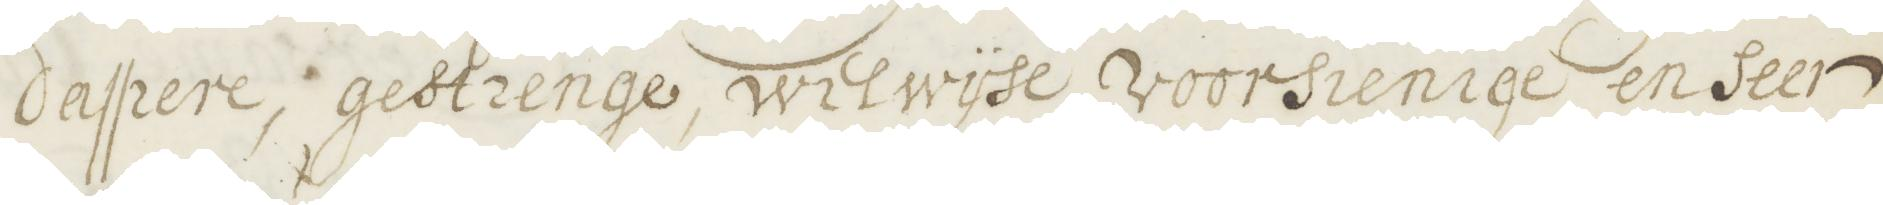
dappere, gestrenge, welwijse, voorsienige en seer
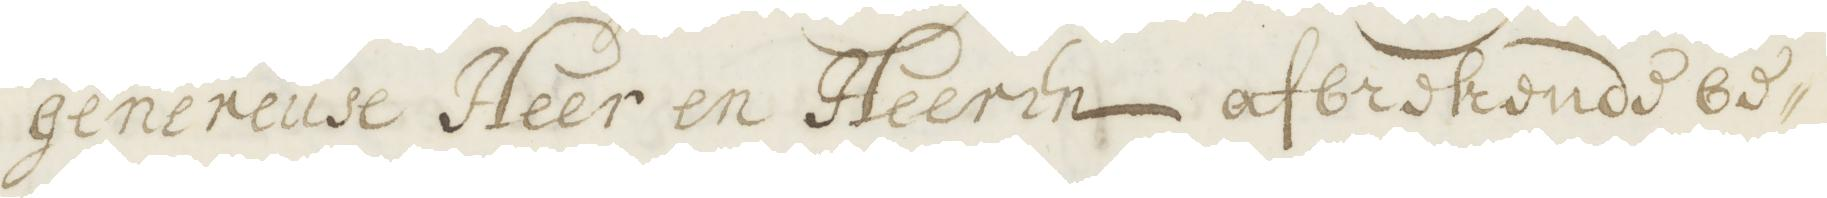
genereuse Heer en Heeren afbrekende be„
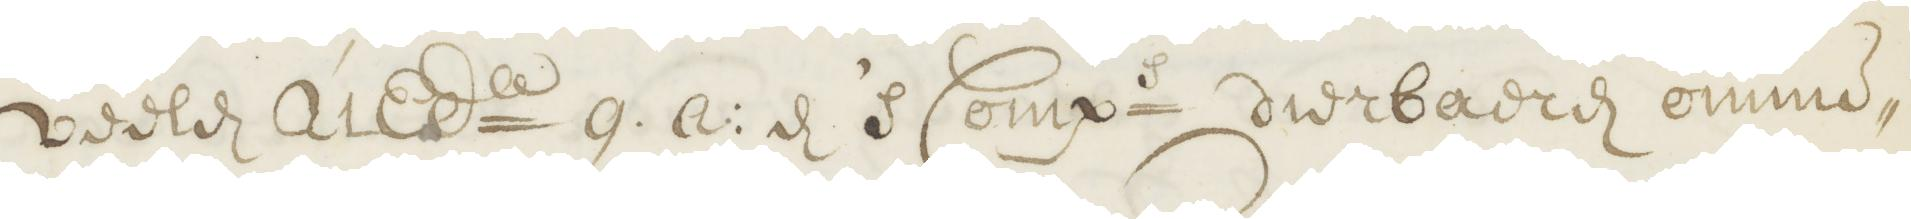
veelen UEd=le 9. a: en ’s Comp=s dierbaeren omme„
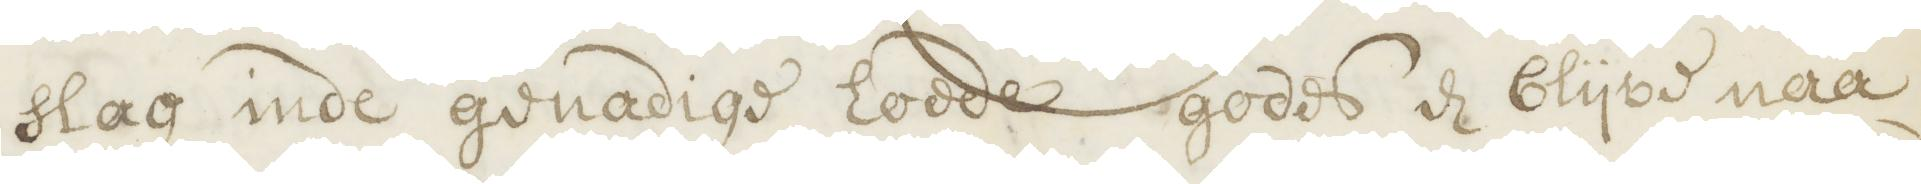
slag inde genadige hoede godes en blijve naa
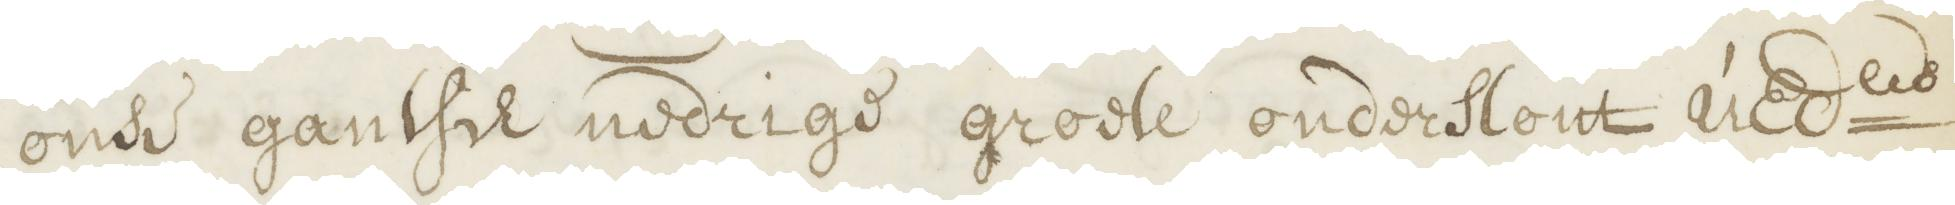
onse gantsch nedrige groete onderstont uEd=les
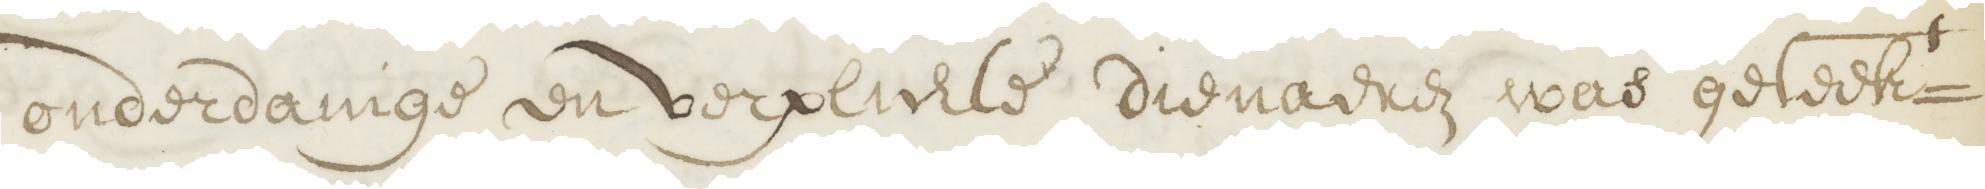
onderdanige en verplichte dienaeren was geteek=t
